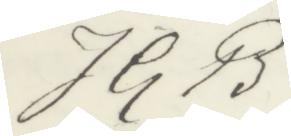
J G B
